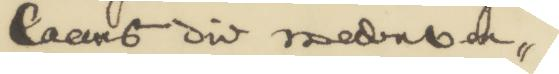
laars die weder ver„
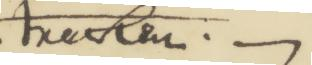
trecken. —
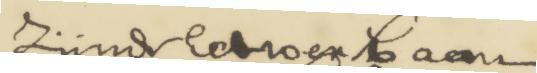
zijnde het werk aan
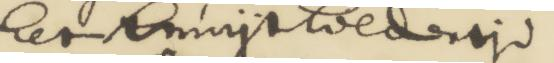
het kruijtkeldertje
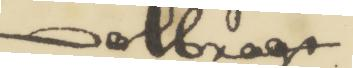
volbragt
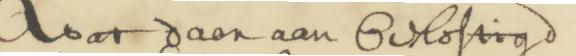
wat daar aan bekostigd
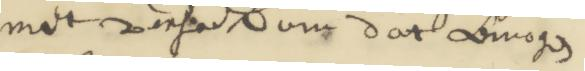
met versoek om dat temogen
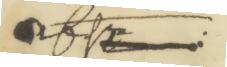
afsz:
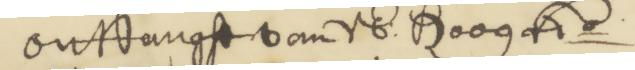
ontfangst van VE: Hoog Ed=s
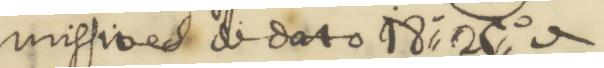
missives de dato 18„e 25„e en
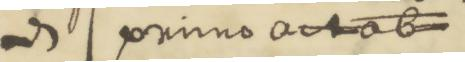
en primo octob-
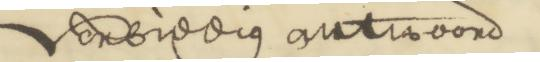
Eerbiedig antwoord
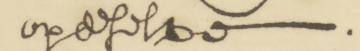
op deselve.
